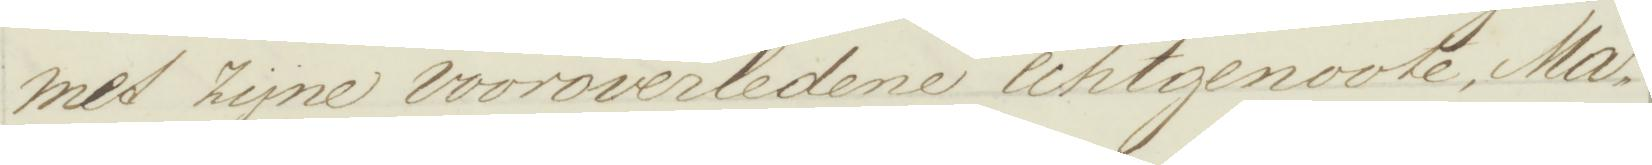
met zijne vooroverledene Echtgenoote, Ma„
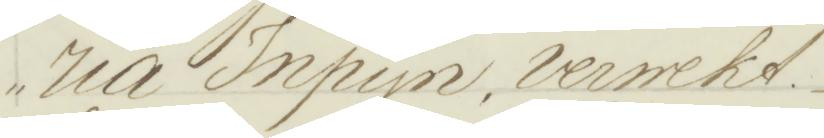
„ria Inpijn, verwekt.
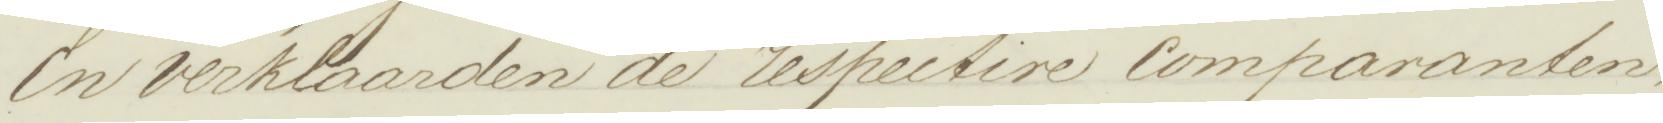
En verklaarden de respective Comparanten
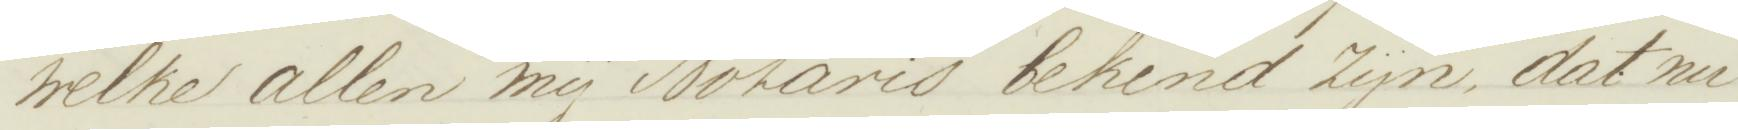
welke allen mij Notaris bekend zijn, dat nu
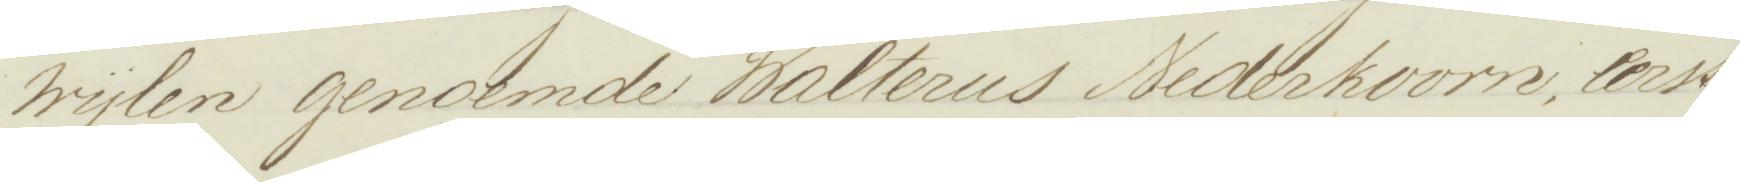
wijlen genoemde Walterus Nederkoorn, Eerst
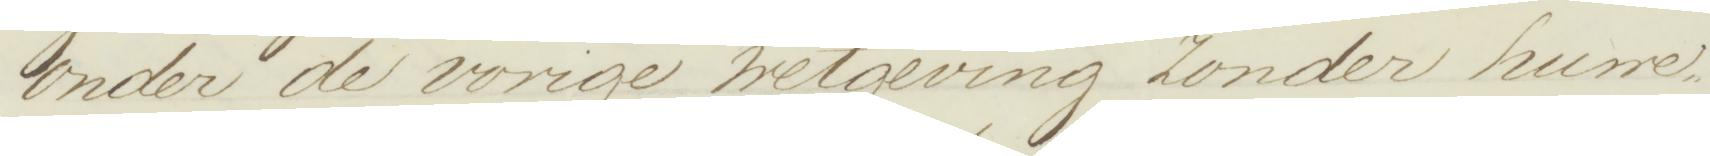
onder de vorige wetgeving zonder huwe„
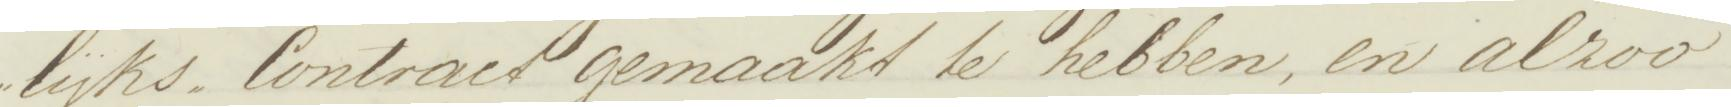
lijks „ Contract gemaakt te hebben, en alzoo
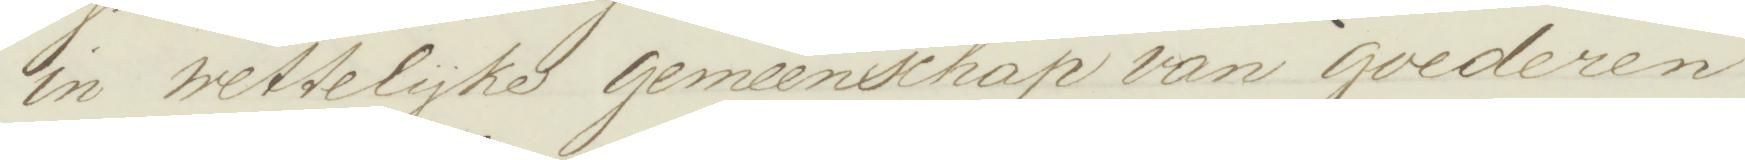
in wettelijke gemeenschap van goederen
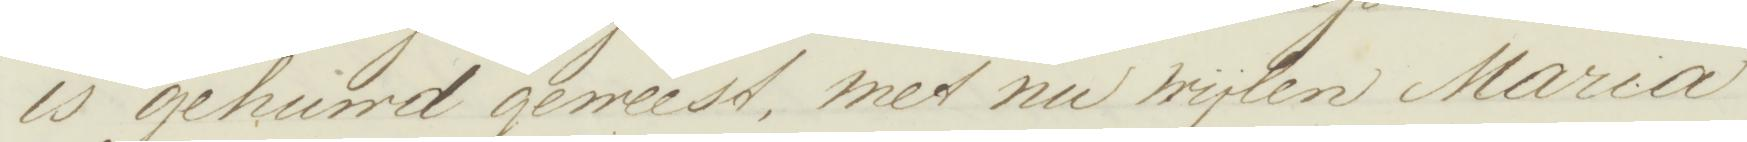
is gehuwd geweest, met nu wijlen Maria
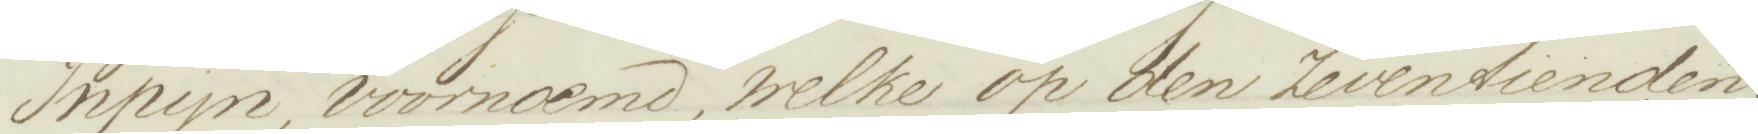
Inpijn, voornoemd, welke op den zeventienden
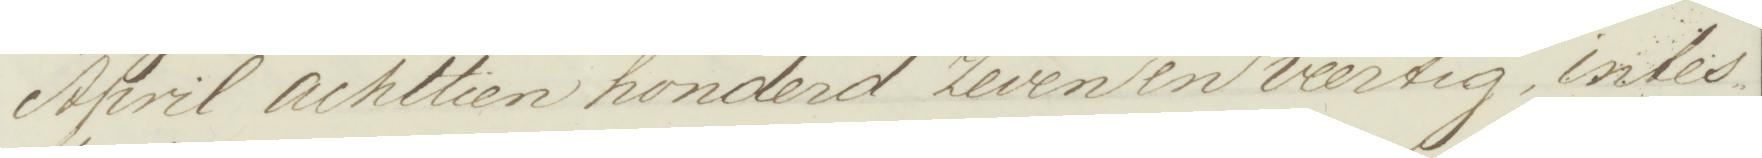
April achttien honderd zeven en veertig, intes„
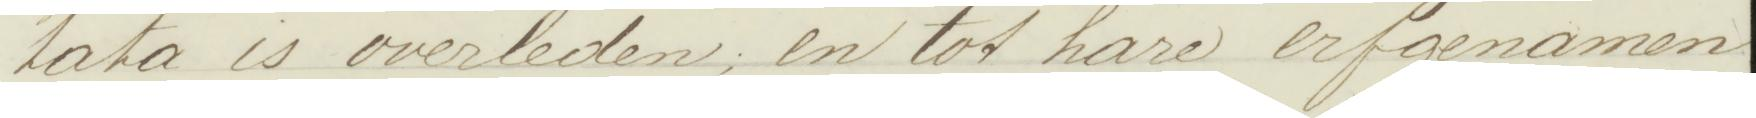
tata is overleden; en tot hare erfgenamen
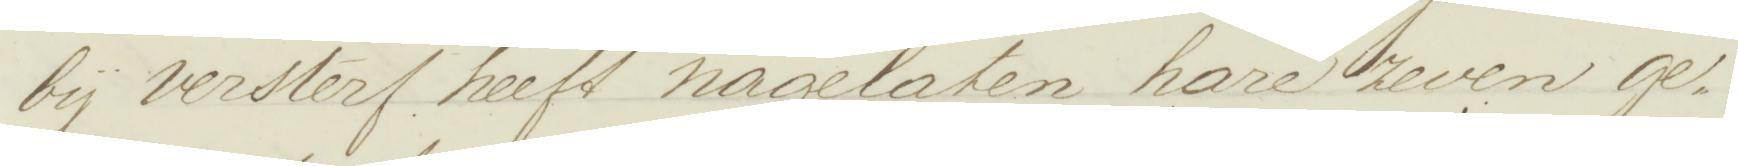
bij versters heeft nagelaten hare zeven ge„
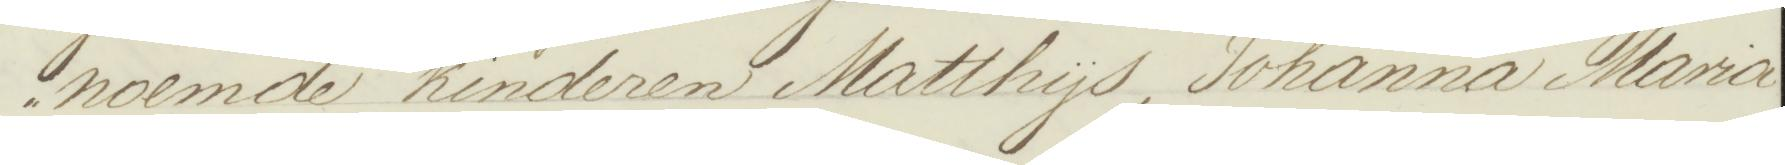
„noemde kinderen Matthijs, Iohanna Maria
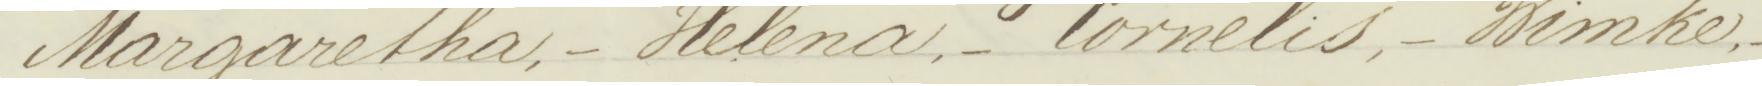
Margaretha, – Helena, – Cornelis, – Wimke,
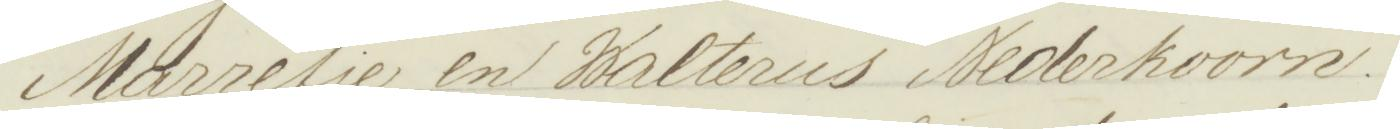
Marretje en Walterus Nederkoorn.
